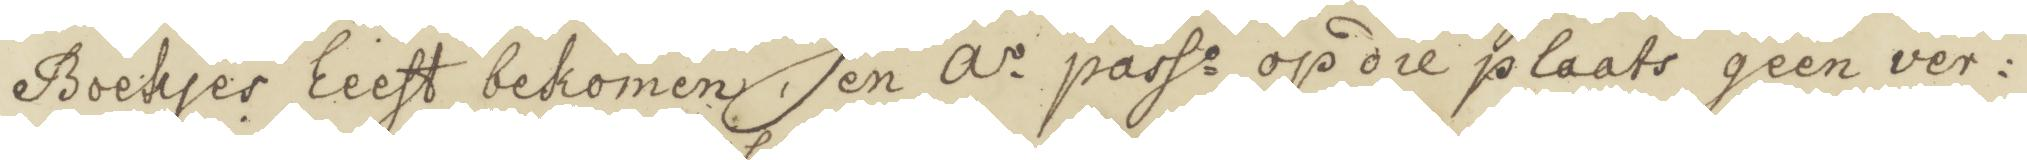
Boekjes heeft bekomen, en a-o pass=o op die plaats geen ver:
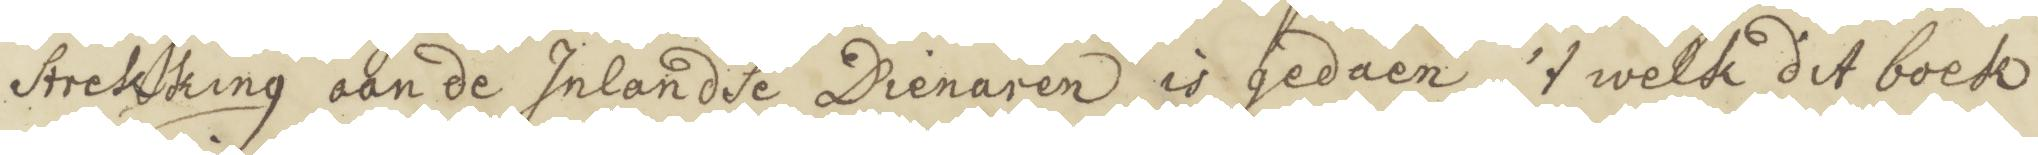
strekking aan de Jnlandse Dienaren is gedaen 't welk dit boek
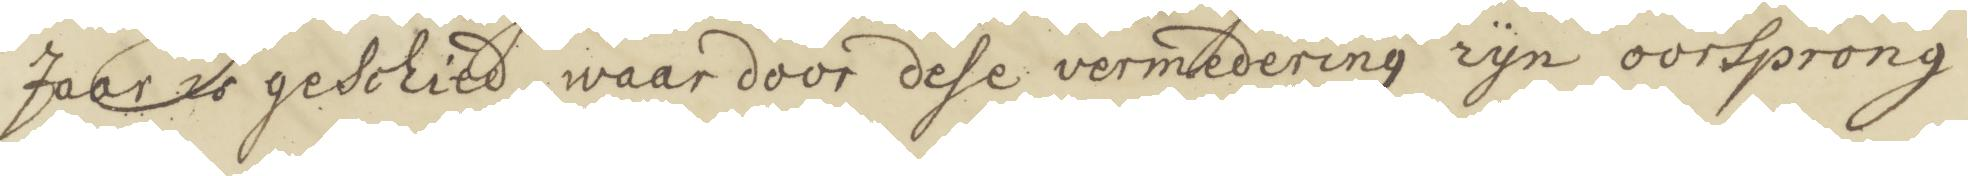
Jaar is geschied, waar door dese vermedering zijn oorsprong
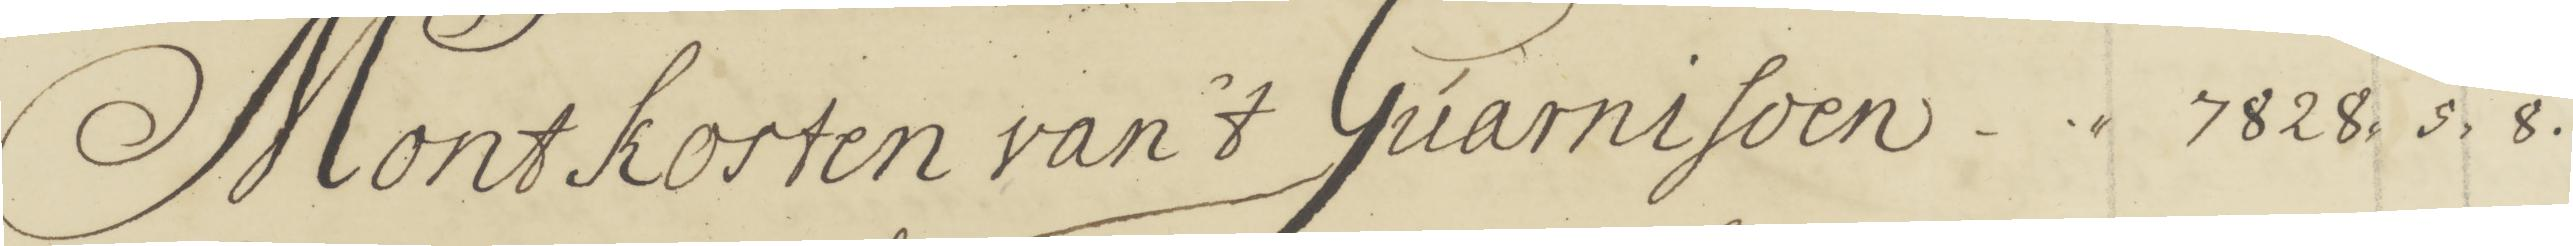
Montkosten van ’t Guarnisoen - . „ 7828„ 5„ 8.
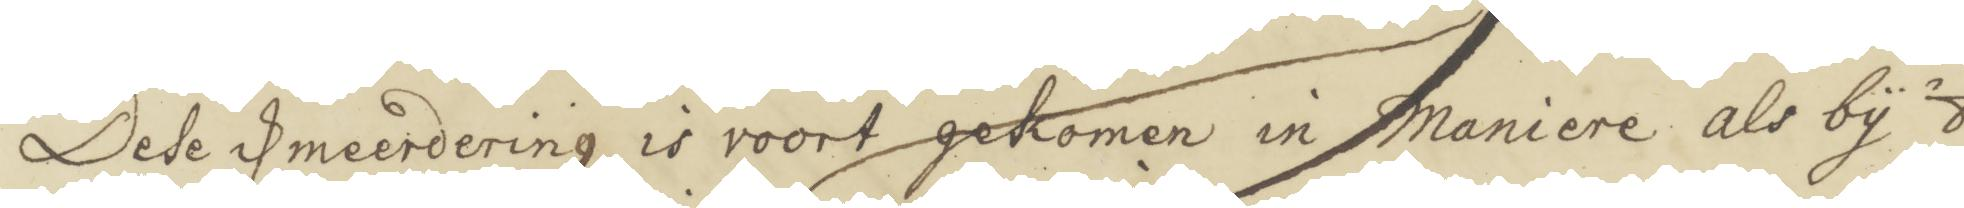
Dese vermeerdering is voort gekomen in maniere als bij 't
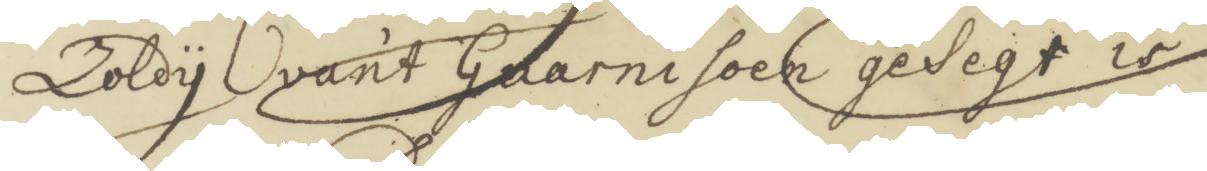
zoldij van't Guarisoen gesegt is
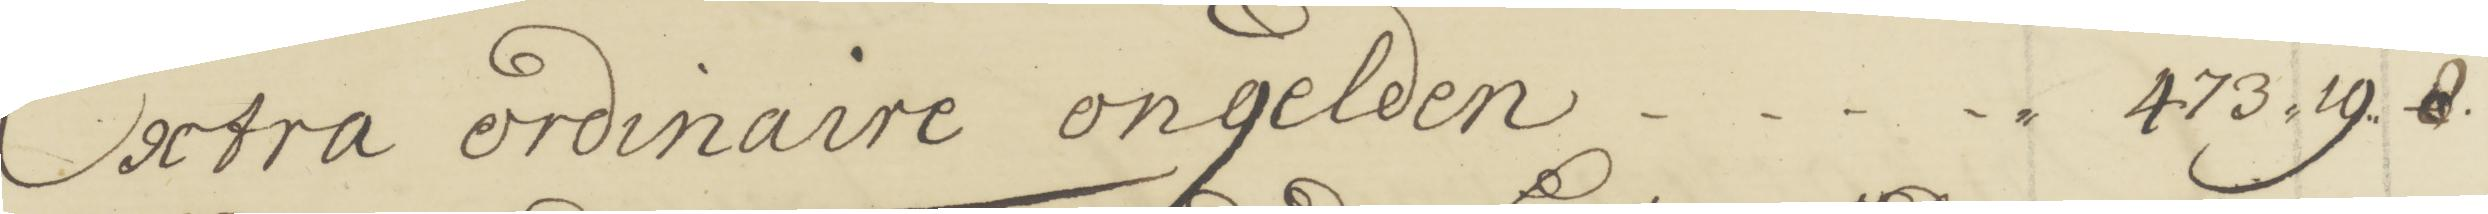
Extra ordinaire ongelden - - - - „ 473„ 19„ 8.
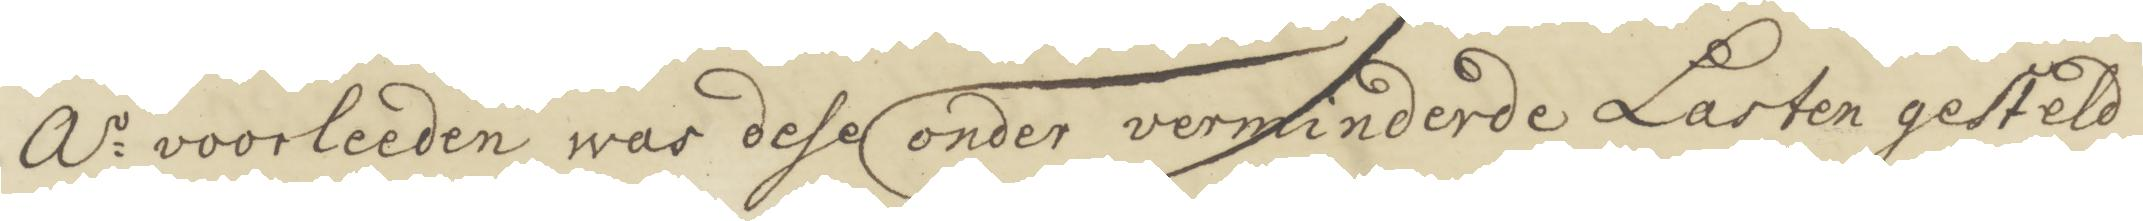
a=o voorleeden was dese onder verminderde Lasten gesteld
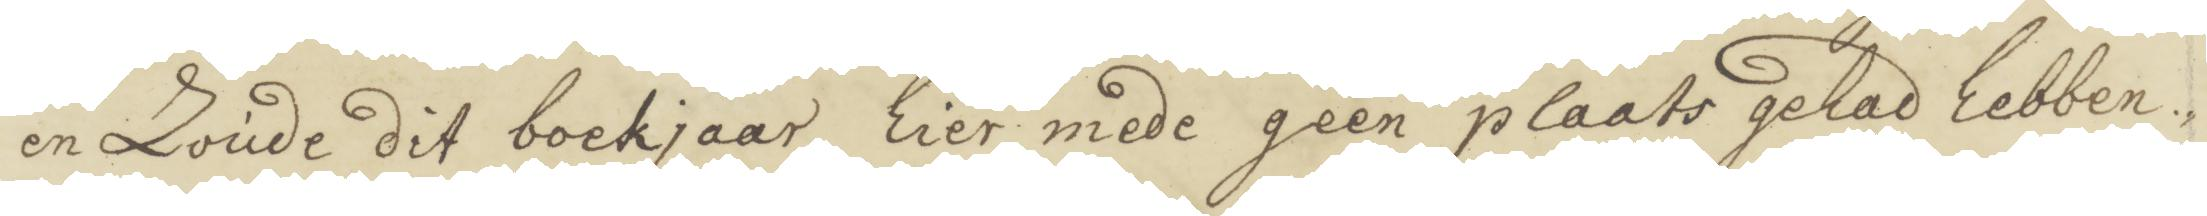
en zoude dit boekjaar hier mede geen plaats gehad hebben.,
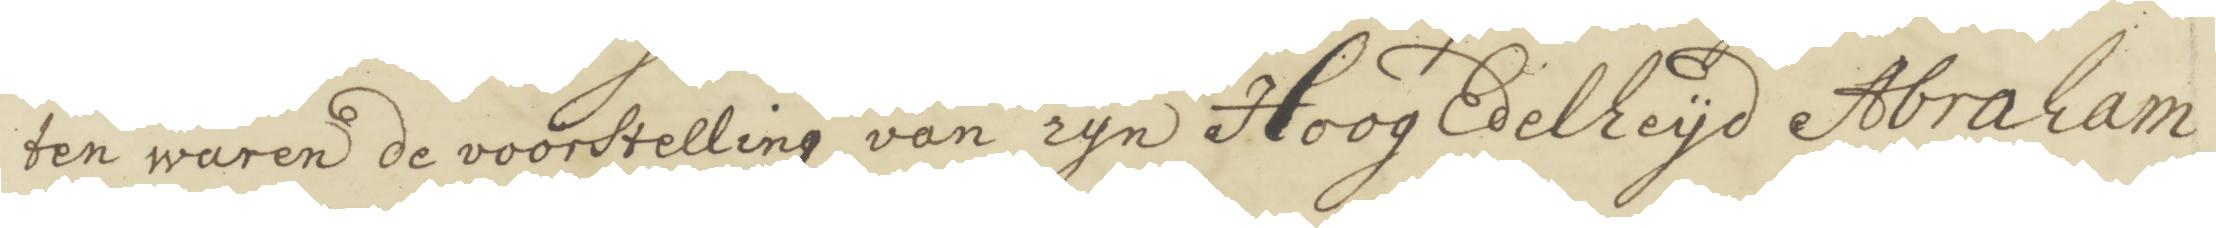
ten waren de voorstelling van zijn Hoog Edelheijd Abraham
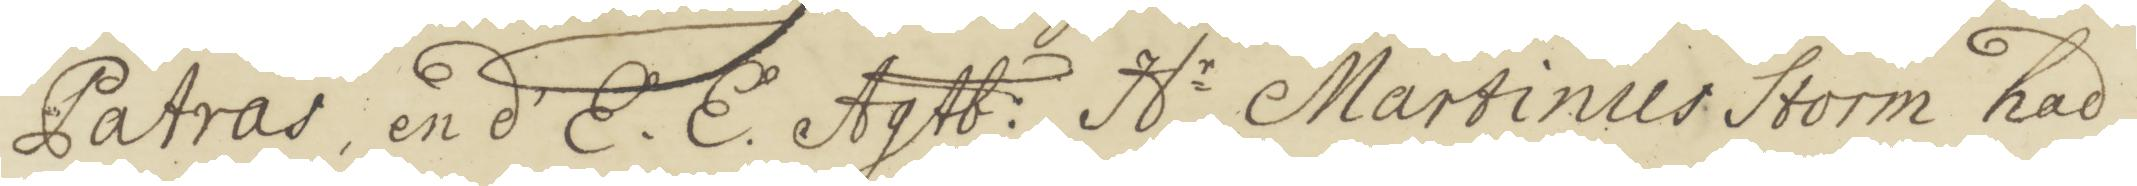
Patras, en d’ E. E. Agtb: H=r Martinus Storm had
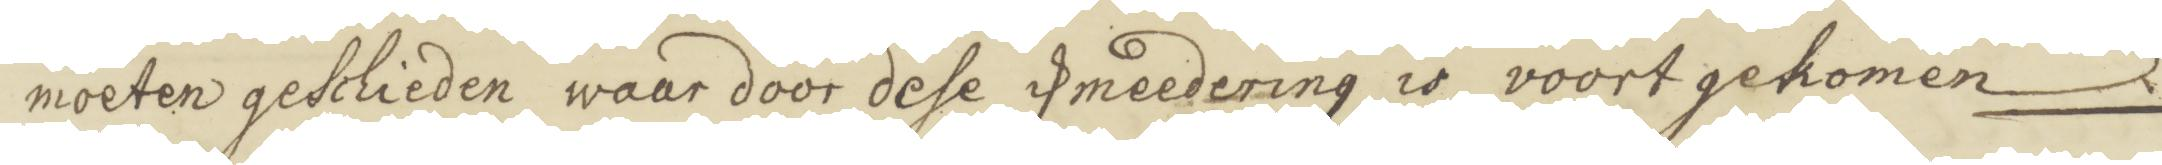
moeten geschieden waar door dese vermeedering is voortgekomen
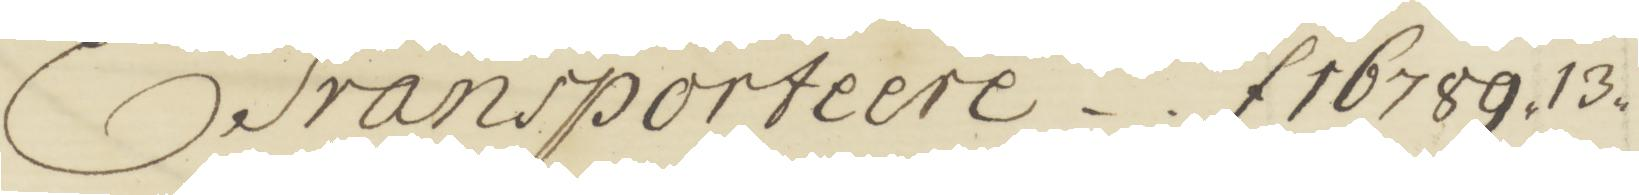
Transporteere - - ƒ16789„13„
